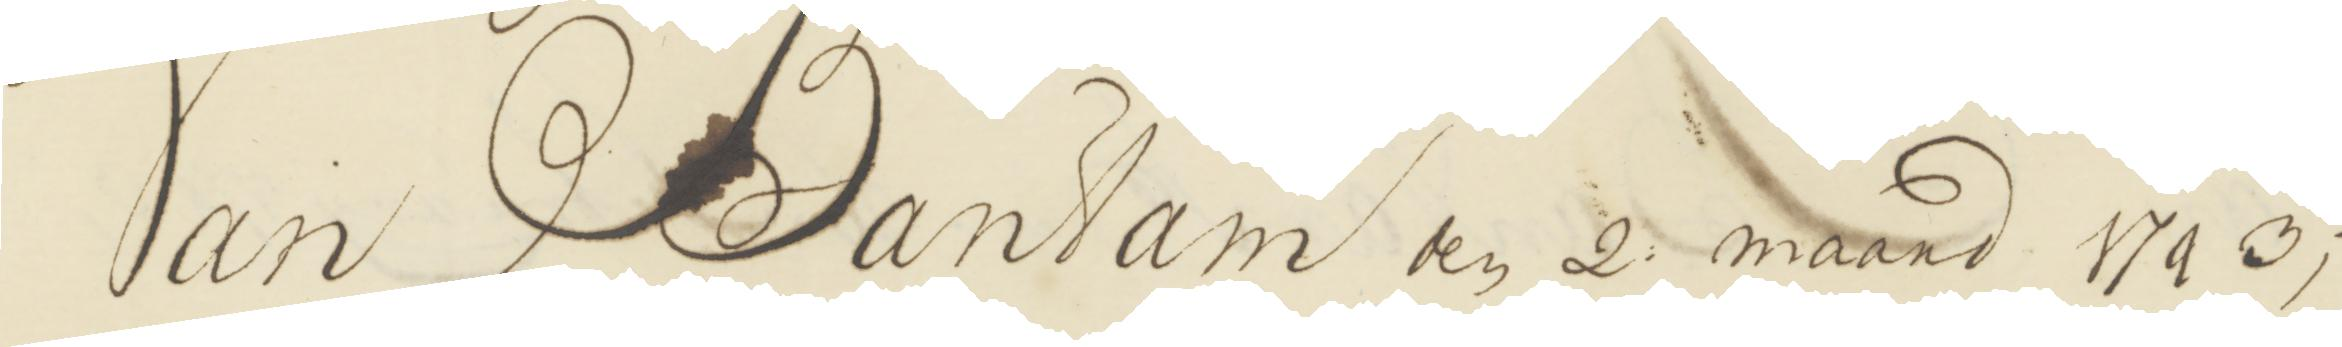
Van Bantam den 2: maard 1743;
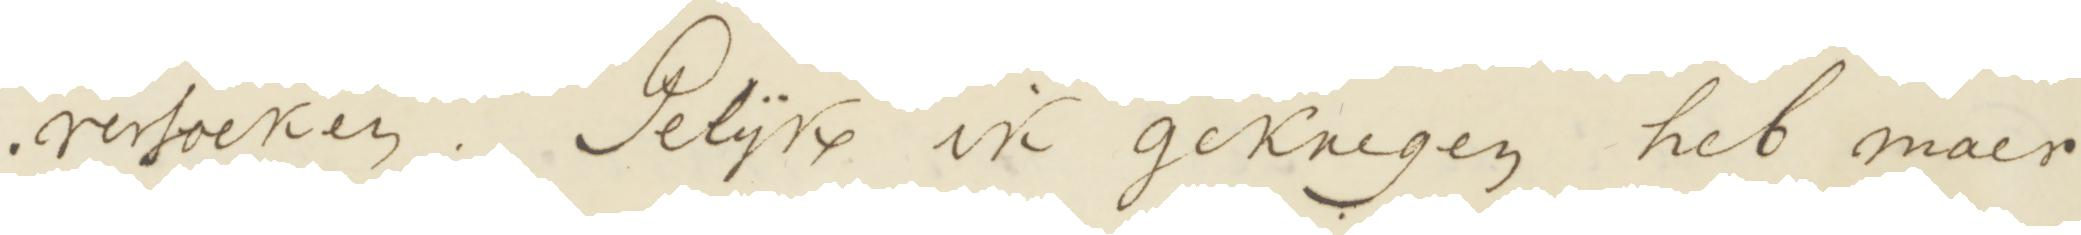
versoeken. Gelijk ik gekregen heb maer
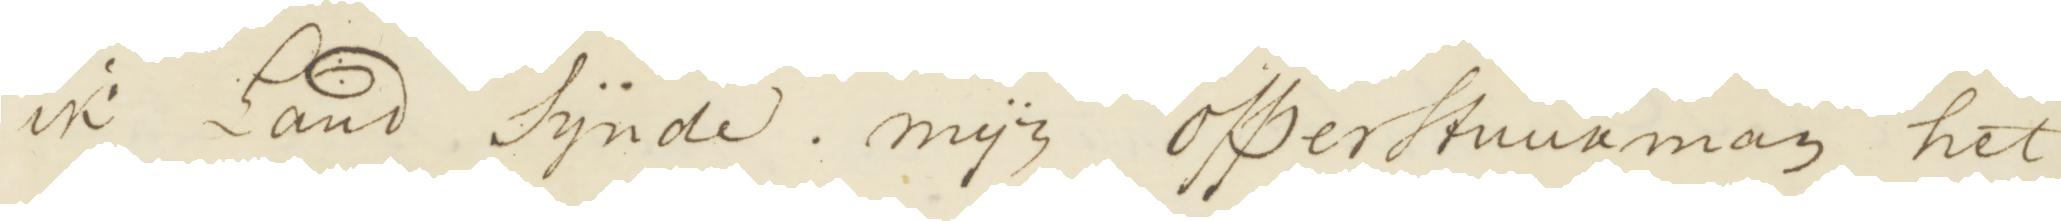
ik land sijnde. mijn opperstuurman het
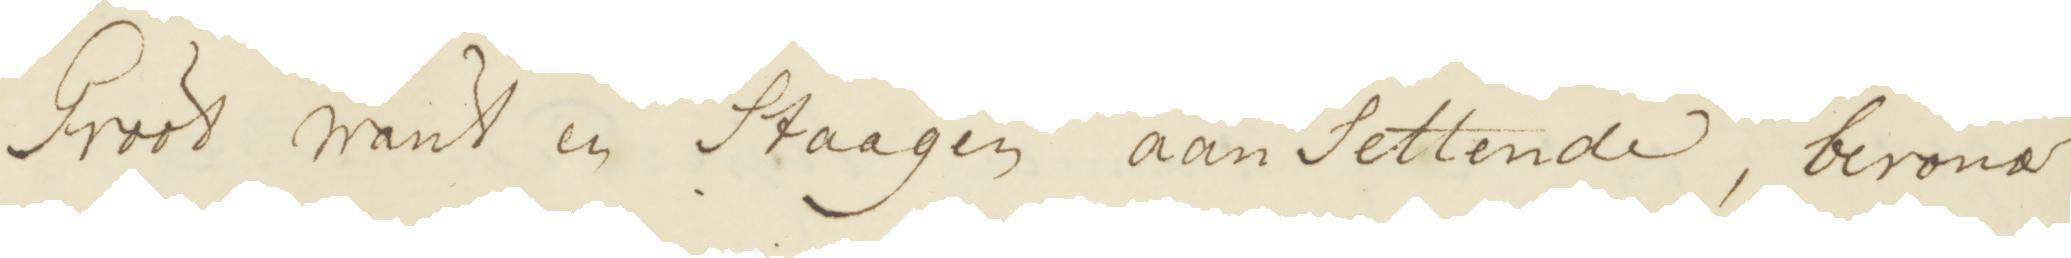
Groot want en staagen aan settende, bevonde
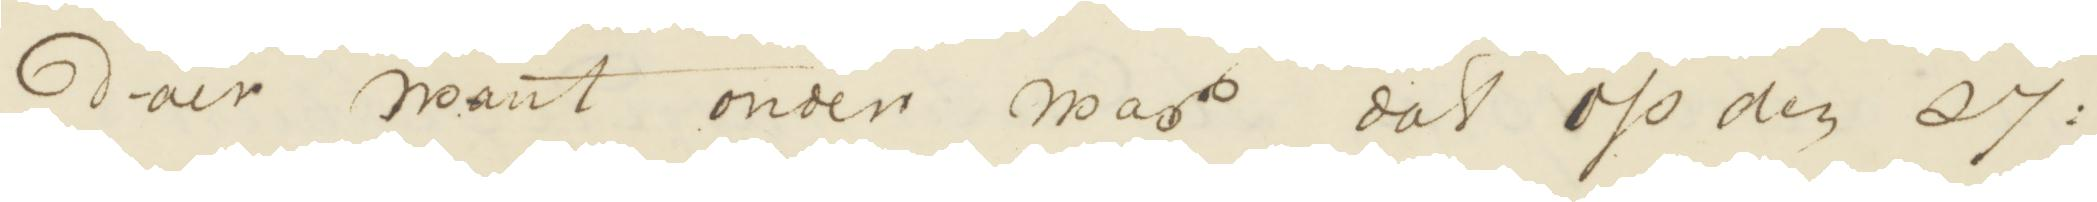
daer want onder was dat op den 27:
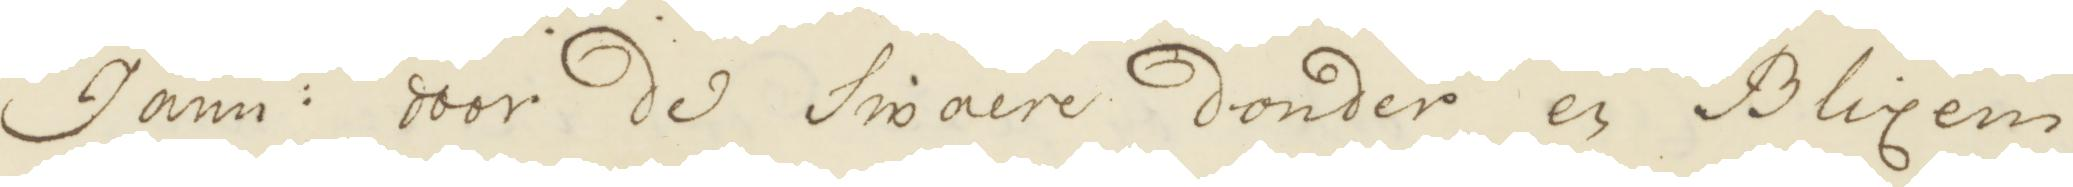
Iann: door de swaere donder en Blixem
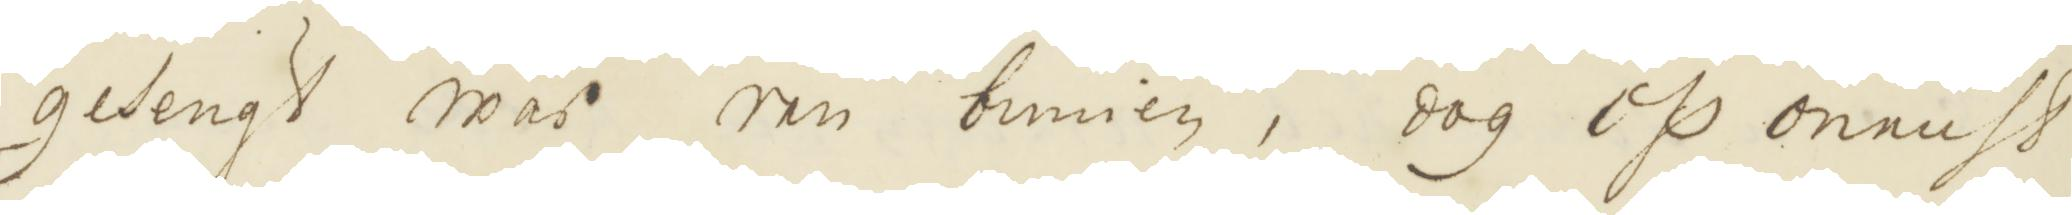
gesengt was van binnen, dog op onrust
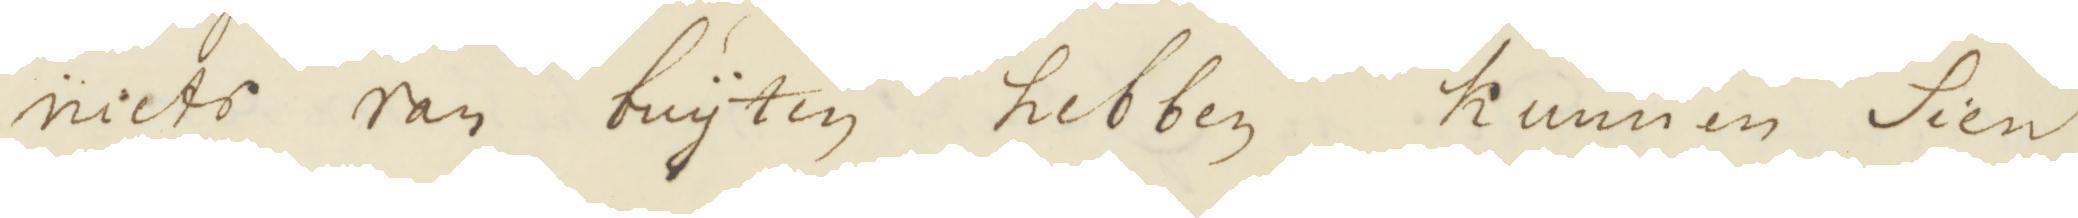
niets van buijten hebben kunnen sien
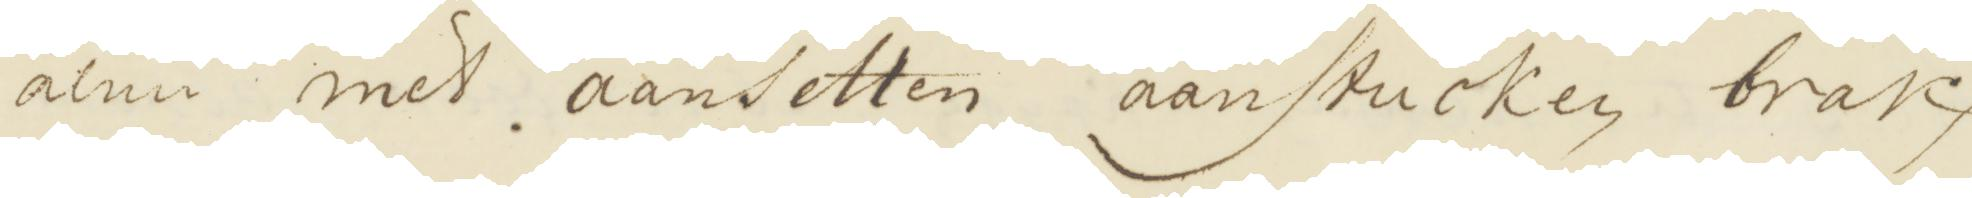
alnu met aansetten aanstucken brak
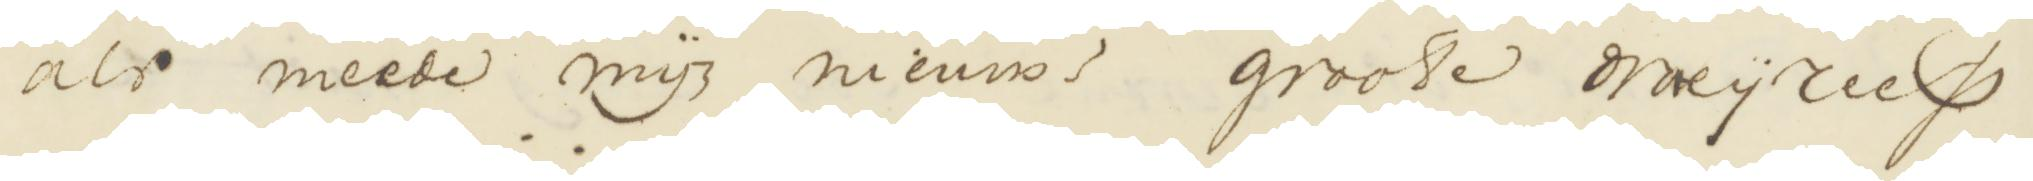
als meede mijn nieuwe groote draeijreep
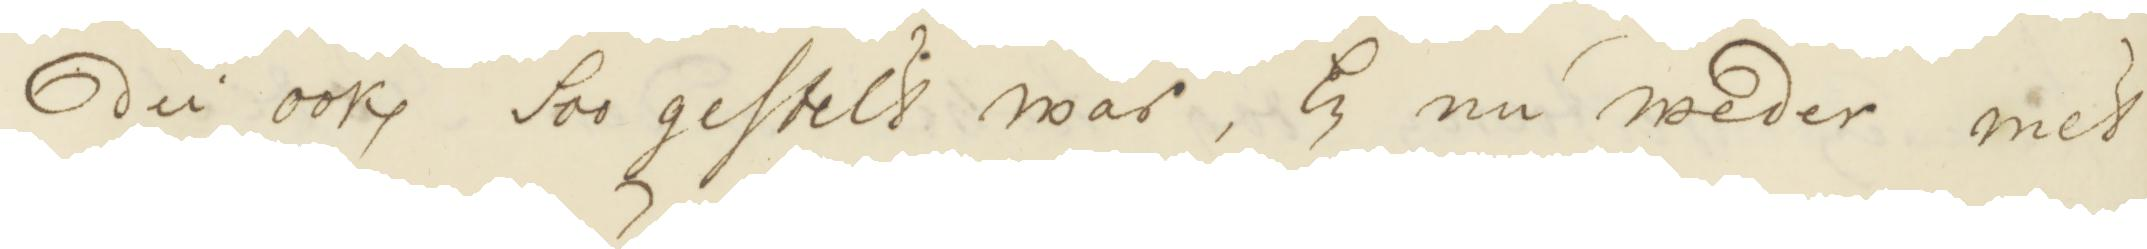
die ook soo gestelt was, En nu weder met
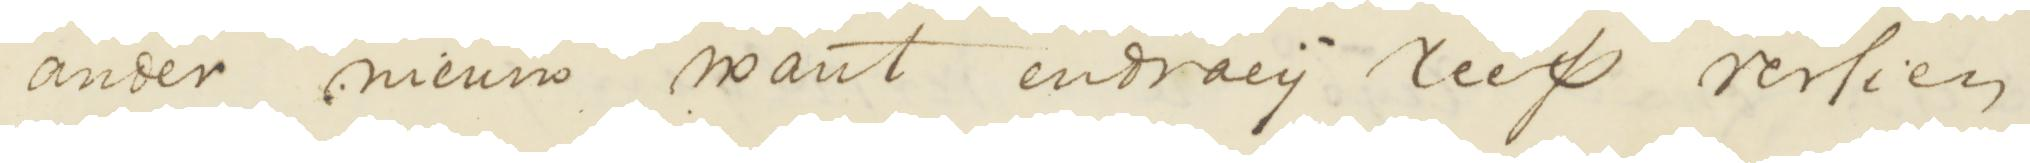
ander nieuw want endraeij reep versien
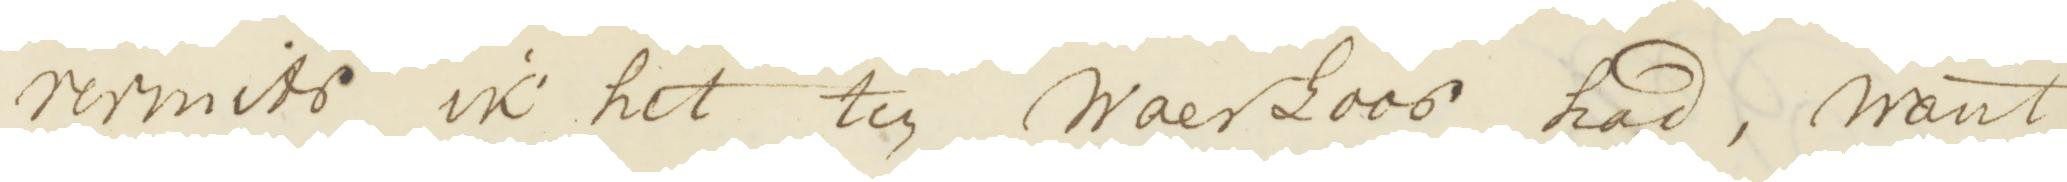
vermits ik het ten waerloos had, want
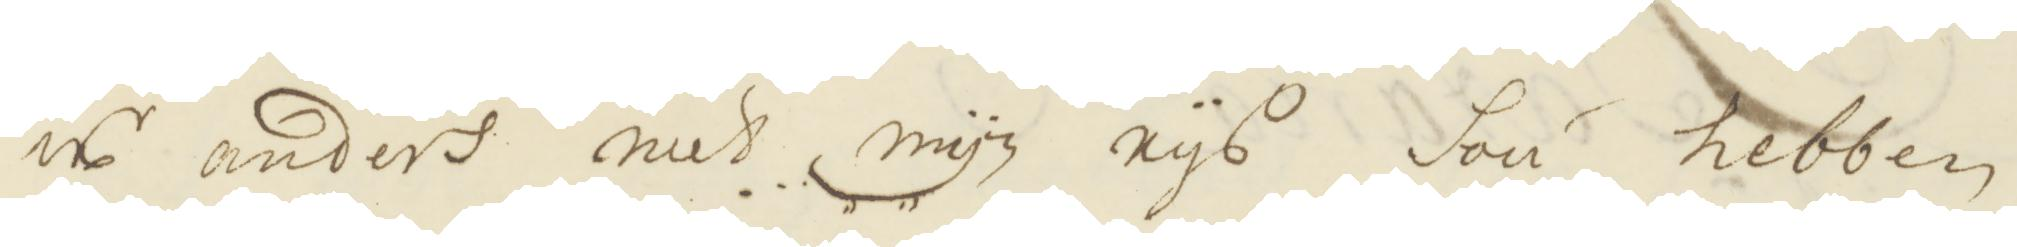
is anders niet mijn rijs sou hebben
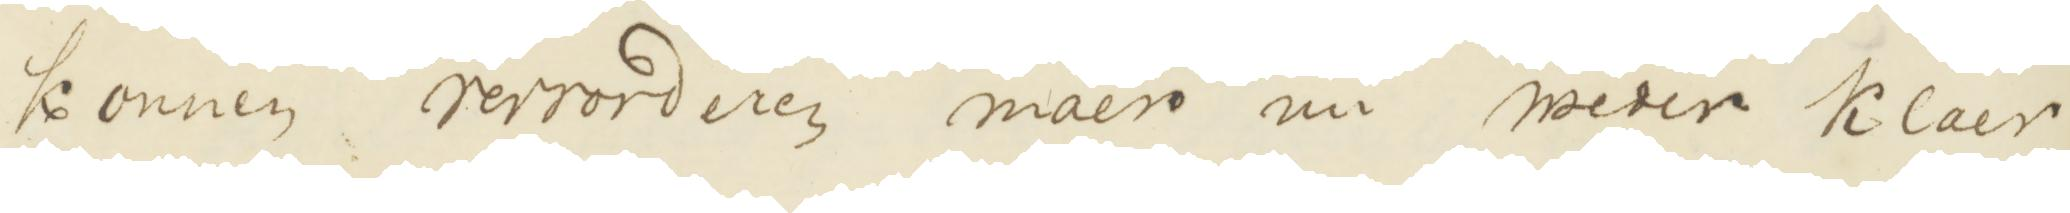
konnen vervorderen maer nu weder klaer
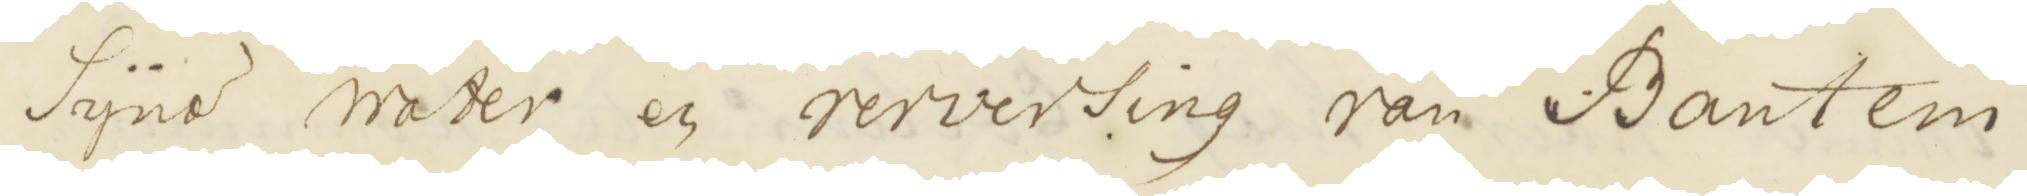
sijne water en verversing van Bantem
